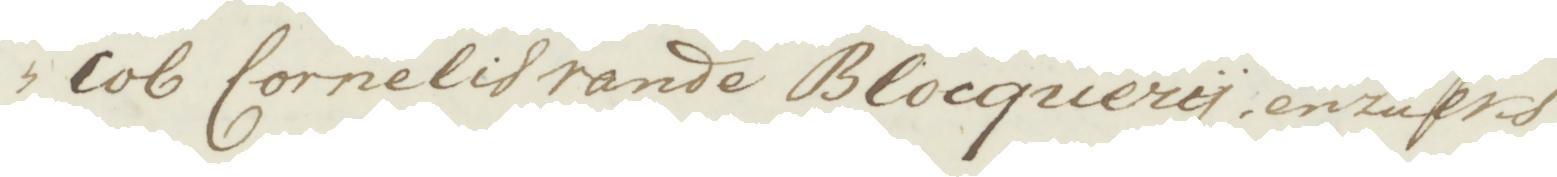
„cob Cornelis vande Blocquerij, en zulks
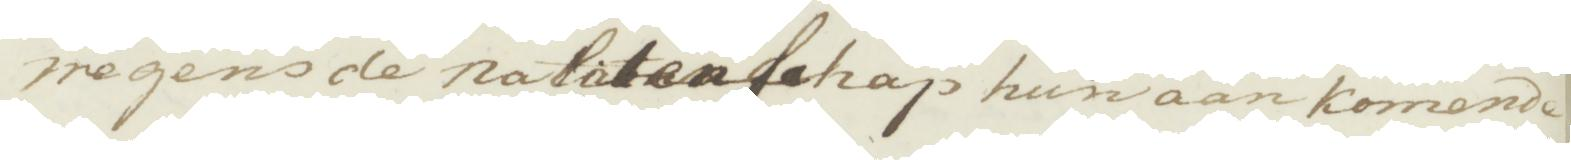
wegens de nalatenschap hun aan komende
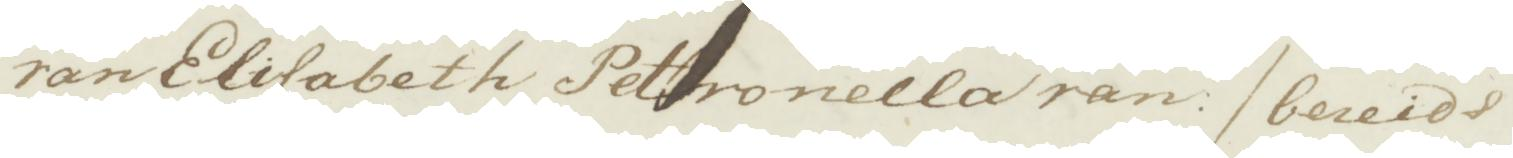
van Elisabeth Petronella van: / bereids
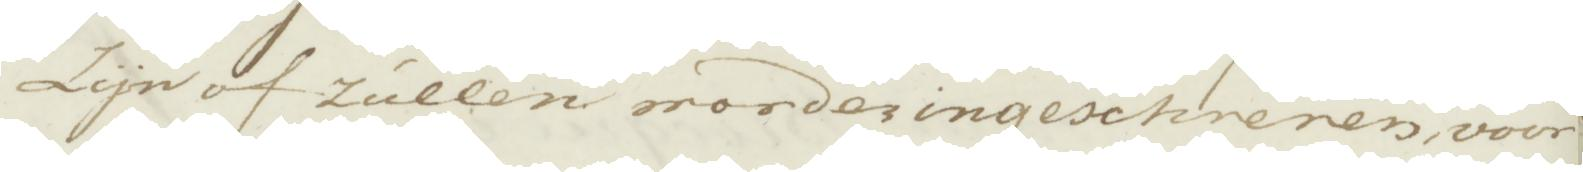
zijn of zullen worden ingeschreven, voor
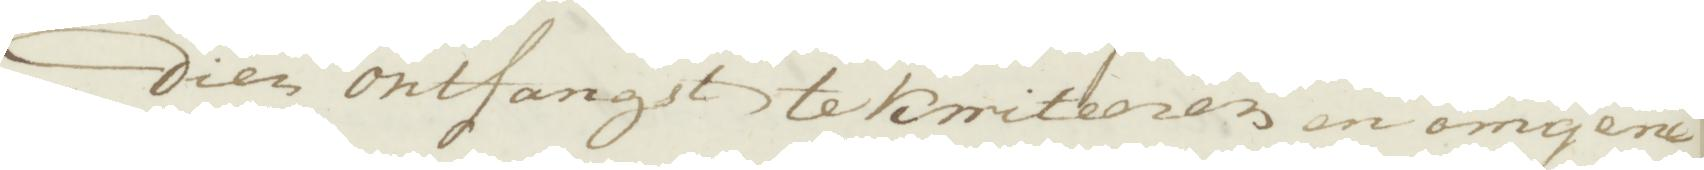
dien ontfangst te kwiteeren en omgene
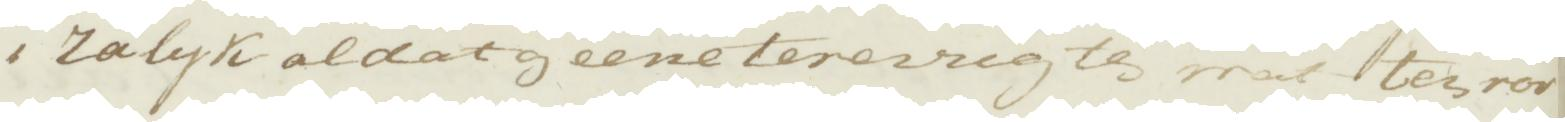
ralijk al dat geene teverrigten wat ten ver
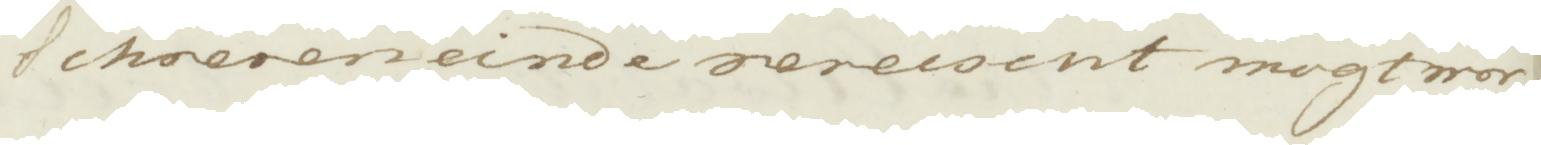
schreven einde vereischt mogt wor
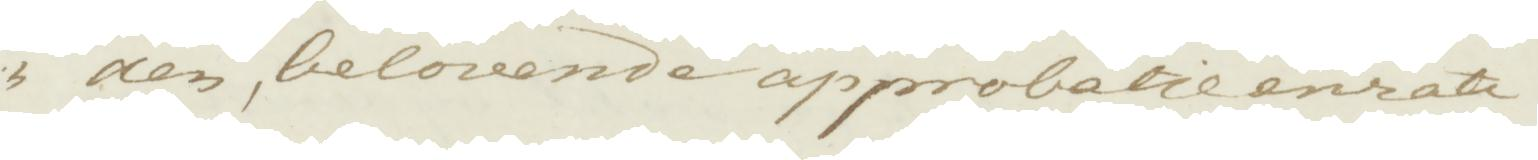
den, belovende approbatie en rati
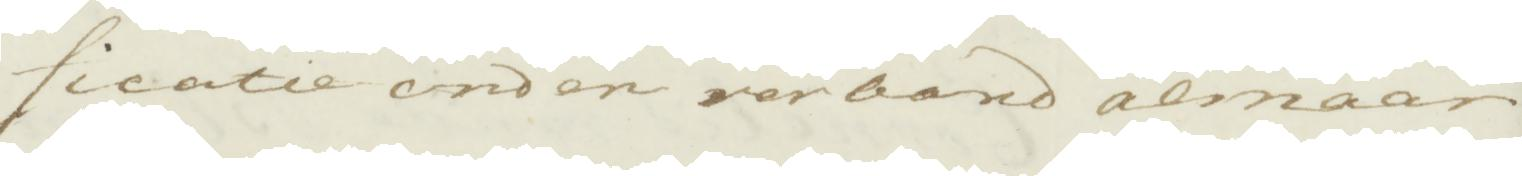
ficatie onder verband alsnaar
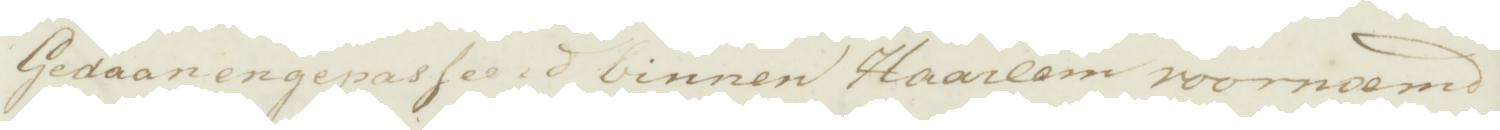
Gedaan en gepasseerd binnen Haarlem voornoemd
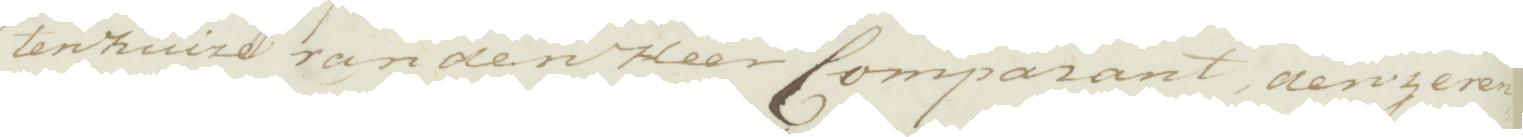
ten huize van den Heer Comparant, den zeven
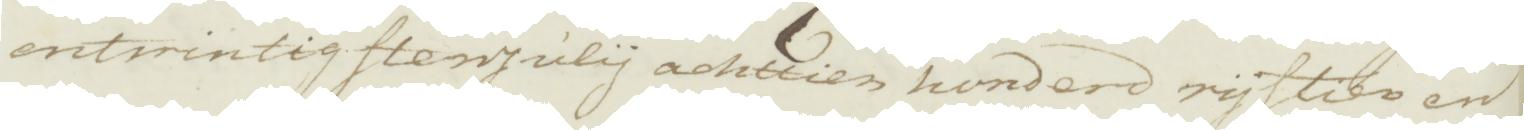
en twintigsten Julij achttien honderd vijftien en
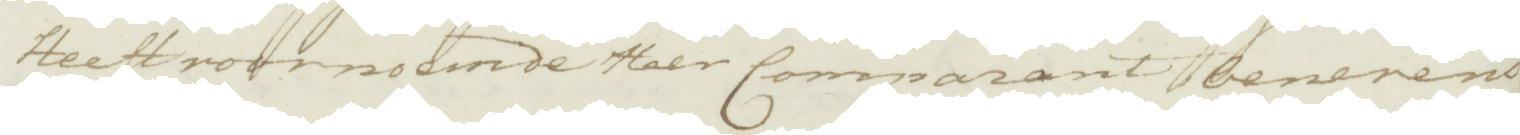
Heeft voornoemde Heer Comparant benevens
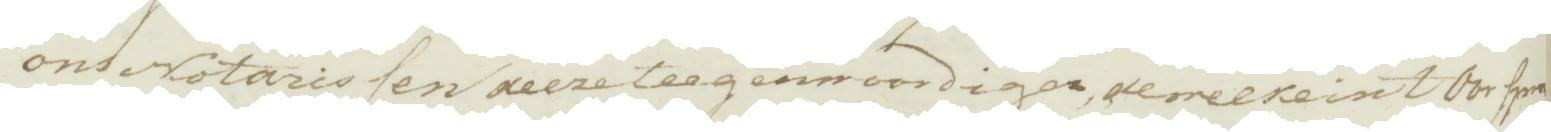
ons Notarissen deeze teegenwoordigen, de welke int Oorspro
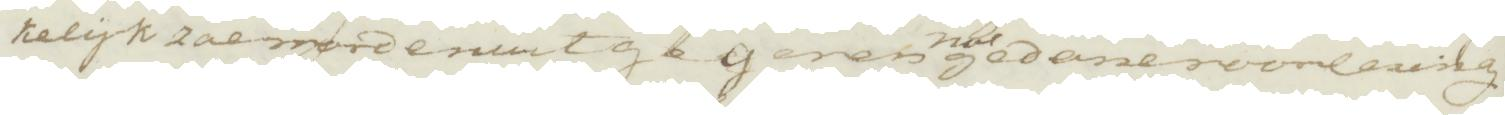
kelijk zal worden uitgegeven gedane voorlezing
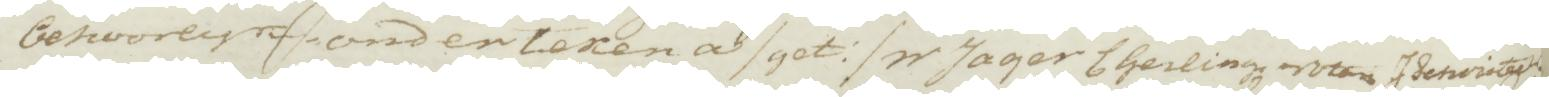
behoorlyk ondertekend / get: / w Jager C Gerling van J Scheringen
